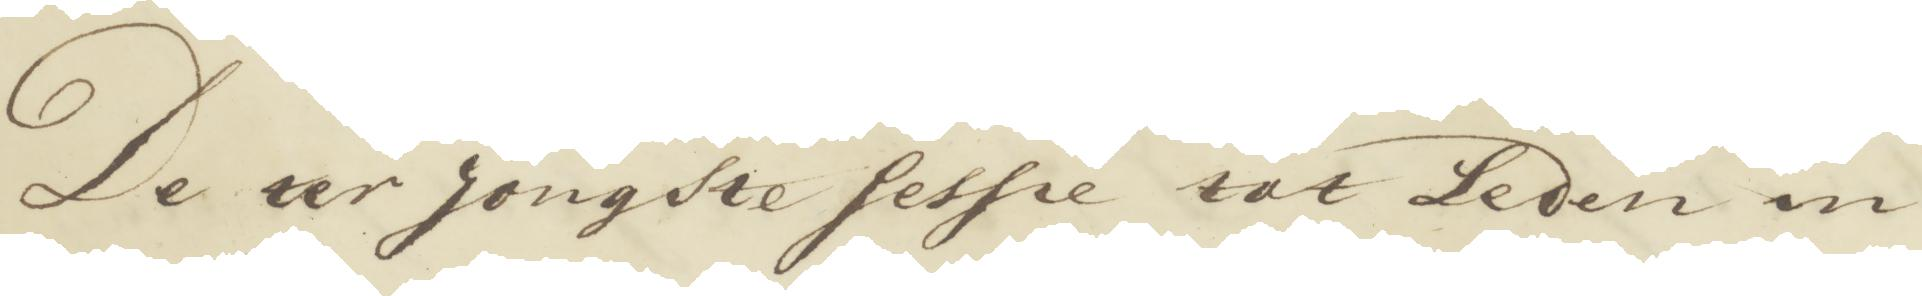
De ter Jongste sessie tot Leden in
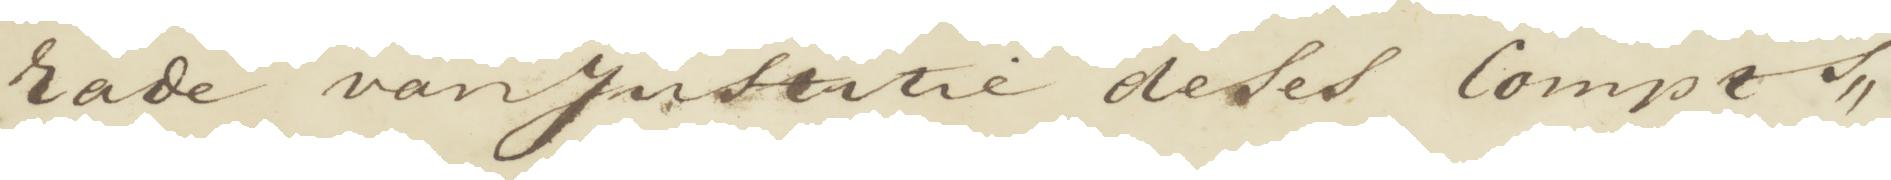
rade van Justitie deses Compt„s
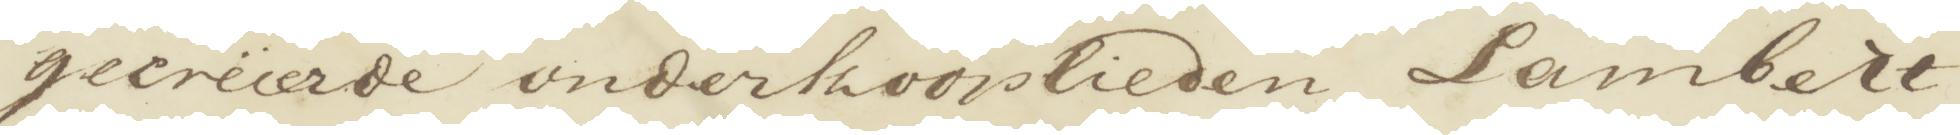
gecreëerde onderkooplieden Lambert
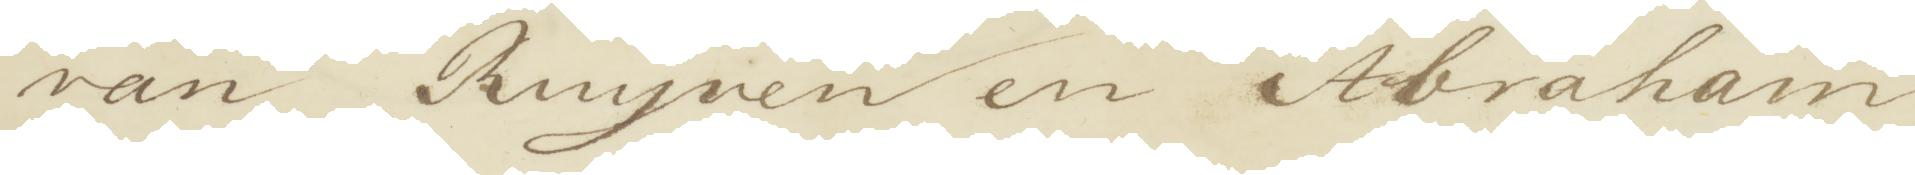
van Ruyen en Abraham
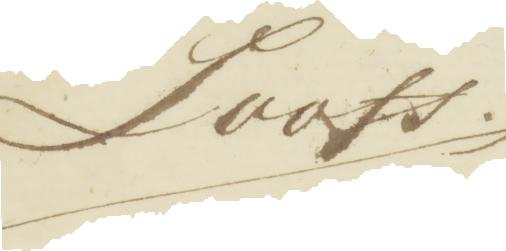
Loofs.
